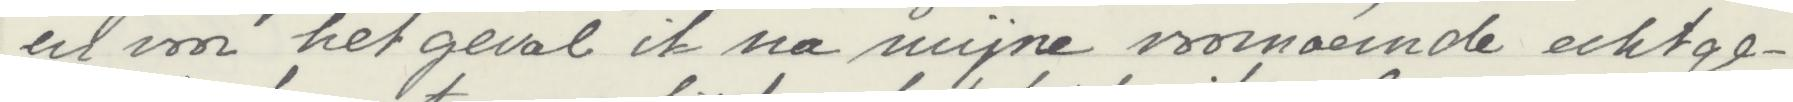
en voor het geval ik na mijne voornoemde echtge-
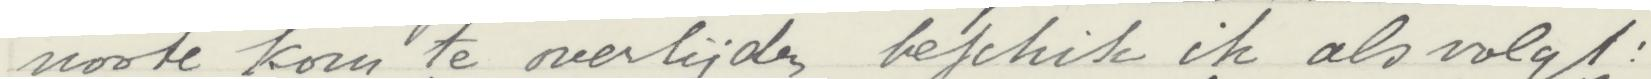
noote kom te overlijden beschik ik als volgt:
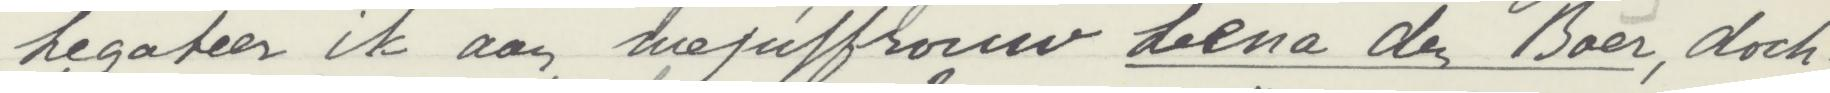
legateer ik aan mejuffrouw Lena den Boer, doch
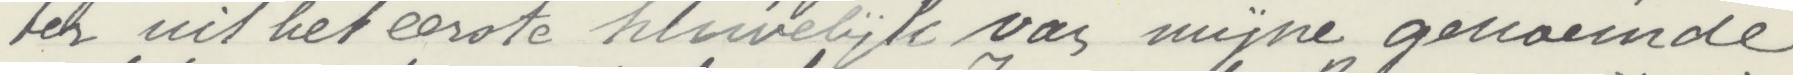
ter uit het eerste huwelijk van mijne genoemde
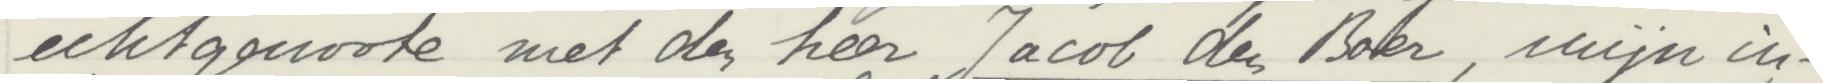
echtgenoote met den heer Jacob den Boer, mijn in-
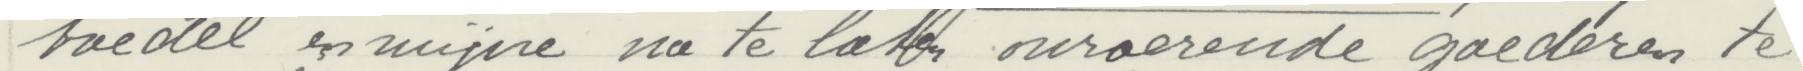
boedel en mijne na te laten onroerende goederen te
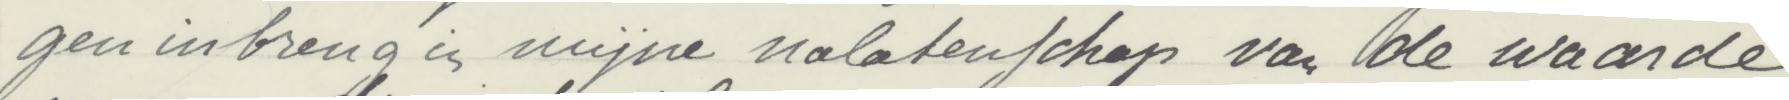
gen inbreng in mijne nalatenschap van de waarde
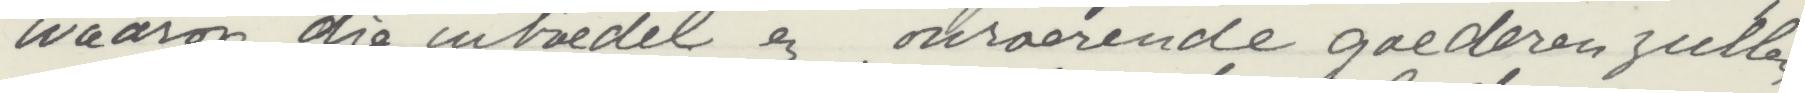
waarop die inboedel en onroerende goederen zullen
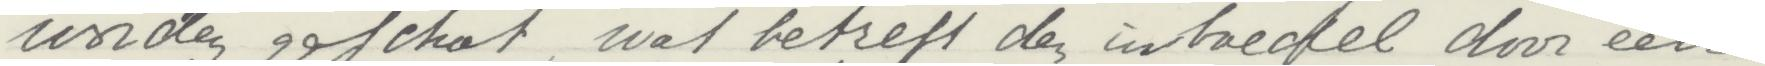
worden geschat, wat betreft den inboedel door een
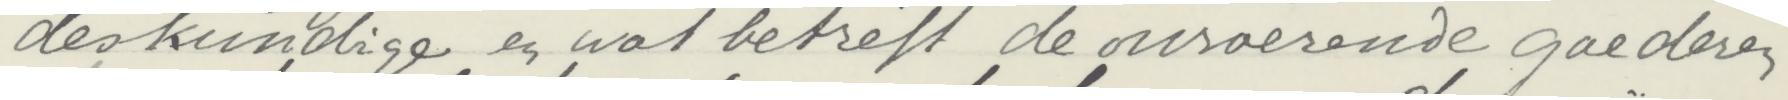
deskundige en wat betreft de onroerende goederen
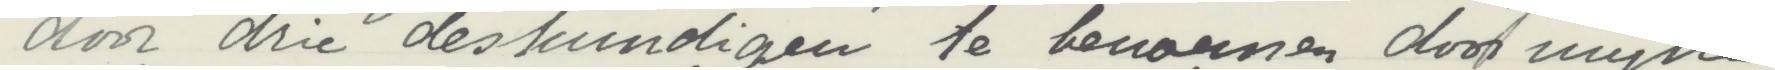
door drie deskundigen te benoemen door mijne
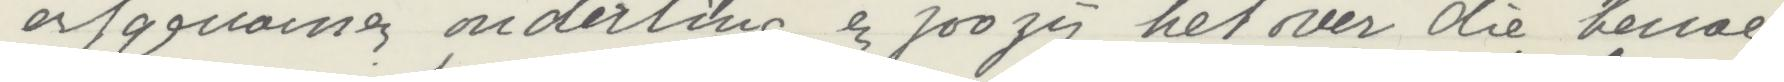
erfgenamen onderling en zoo zij het over die benoe
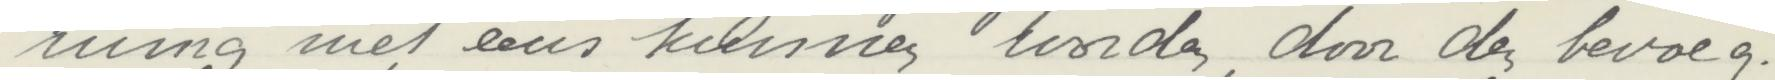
ming niet eens kunnen worden door den bevoeg
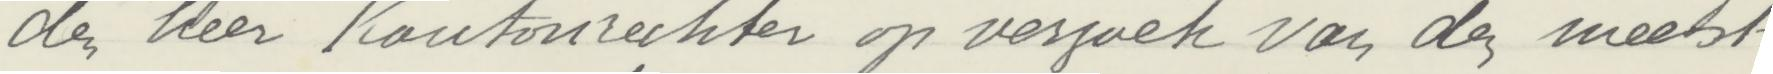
den Heer Kantonrechter op versoek van den meest
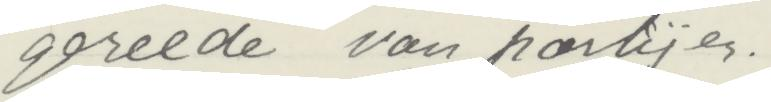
gereede van partijen.
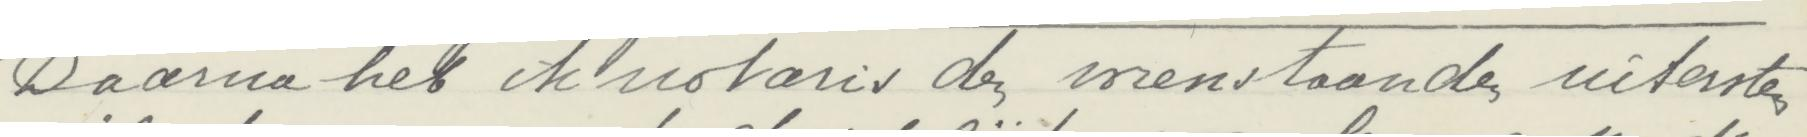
Daarna heb ik notaris den vorenstaanden uitersten
